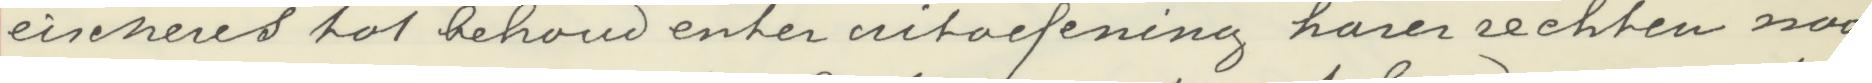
eischeres tot behoud en ter uitoefening harer rechten noo
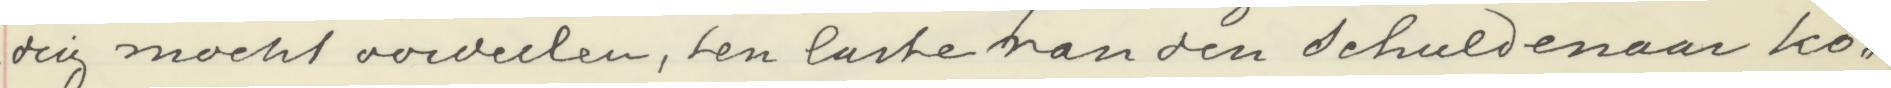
dig mocht oordeelen, ten laste van den schuldenaar ko„
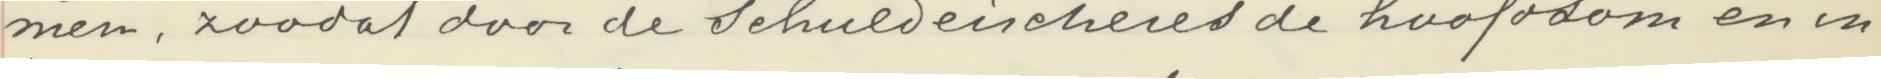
men, zoodat door de schuldeischeres de hoofdsom en in
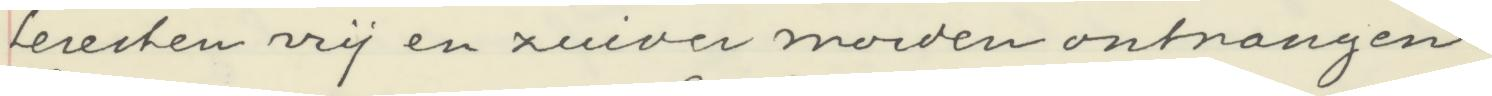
teresten vrij en zuiver worden ontvangen.
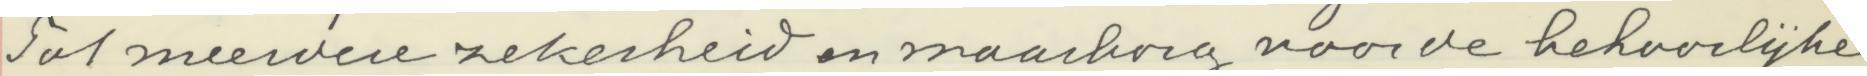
Tot meerdere zekerheid en waarborg voor de behoorlijke
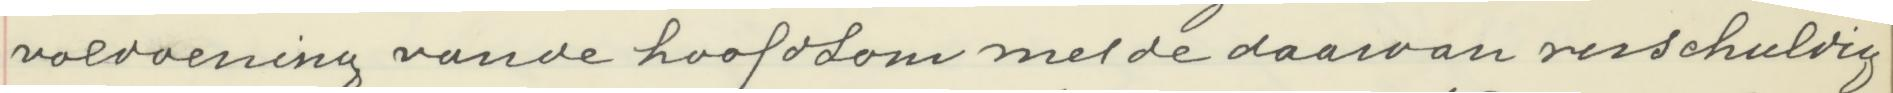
voldoening vande hoofdsom met de daarvan verschuldig
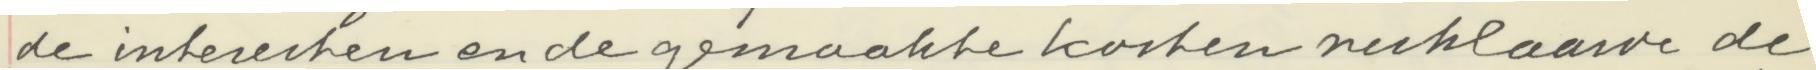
de interesten en de gemaakte kosten verklaarde de
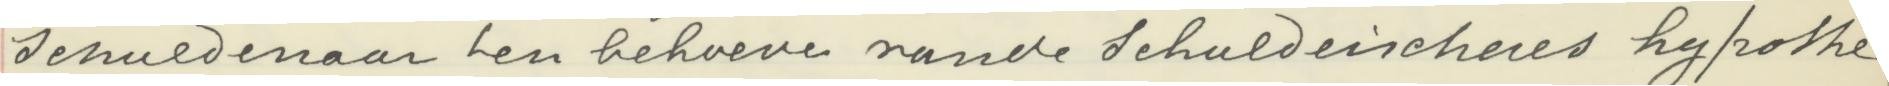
schuldenaar ten behoeve vande schuldeischeres hypothe
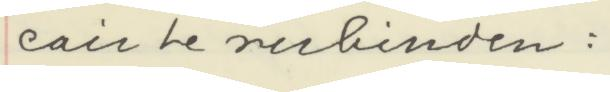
cair te verbinden:
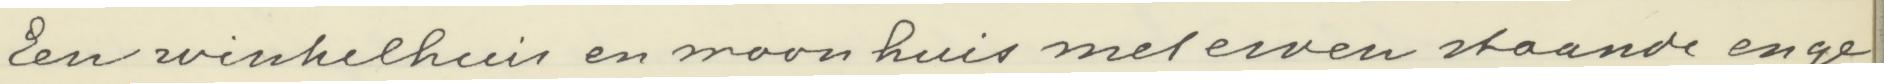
Een winkelhuis en woonhuis met erven staande en ge
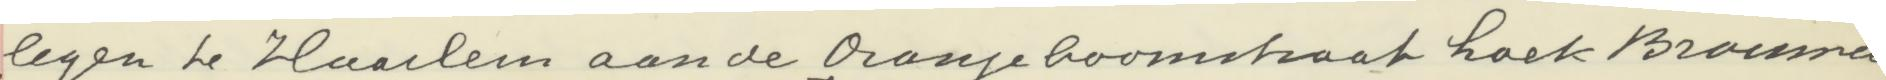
legen te Haarlem aan de Oranje boomstraat hoek Brouwer
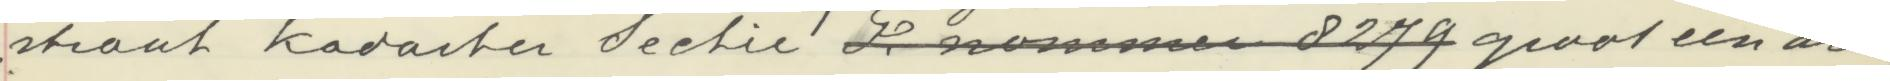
straat kadaster sectie ⁋ nommer 8279 groot een are
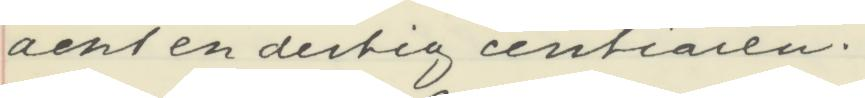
acht en dertig centiaren.
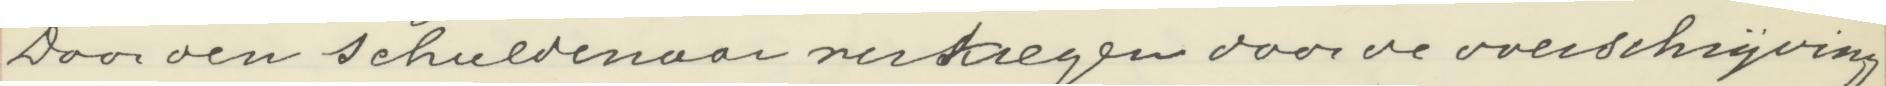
Door den schuldenaar verkregen door de overschrijving
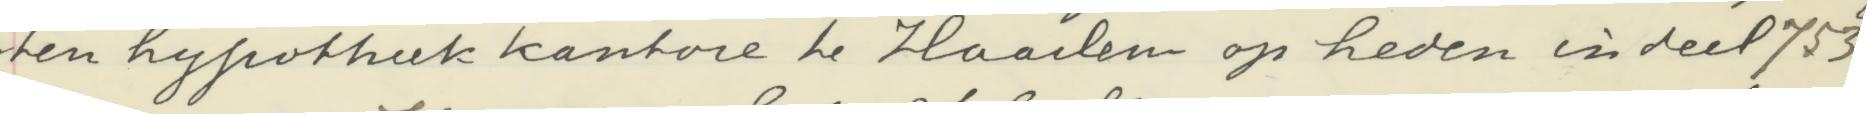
ten hypotheek kantore te Haarlem op heden in deel 753
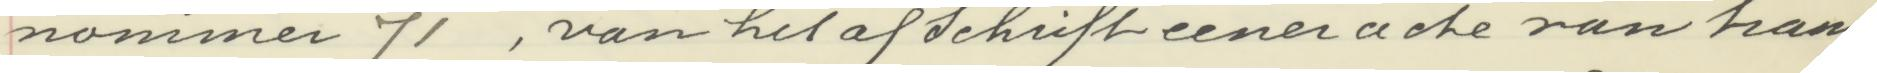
nommer 71, van het afschrift eener acte van trans
